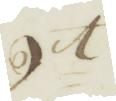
v=t
